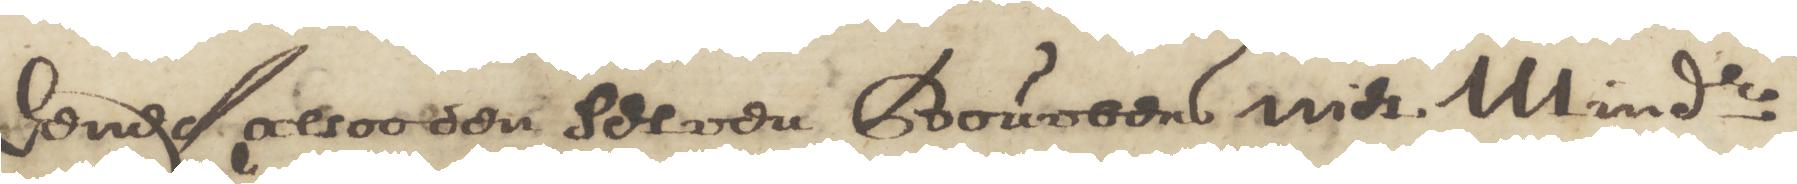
Eenelijk alsoo den selven Bouwers niet Mind=r
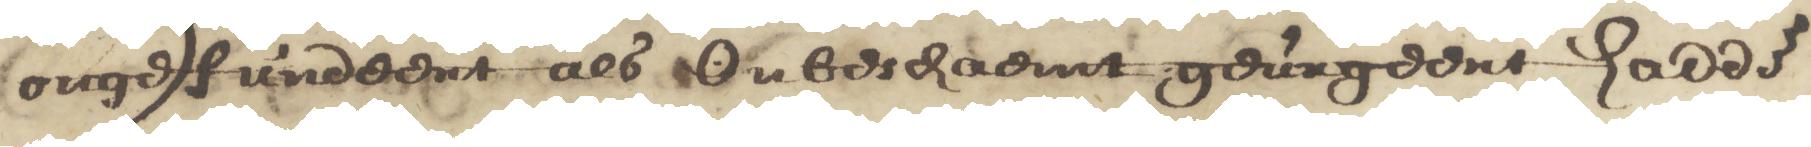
ongefundeert als Onbeschaemt geurgeert hadde
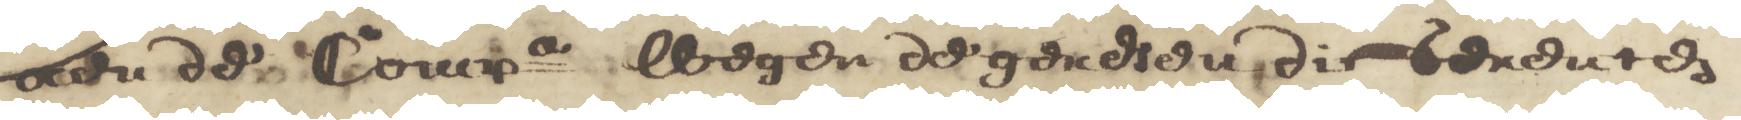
aen de Comp=a wegen de geresen disserenten
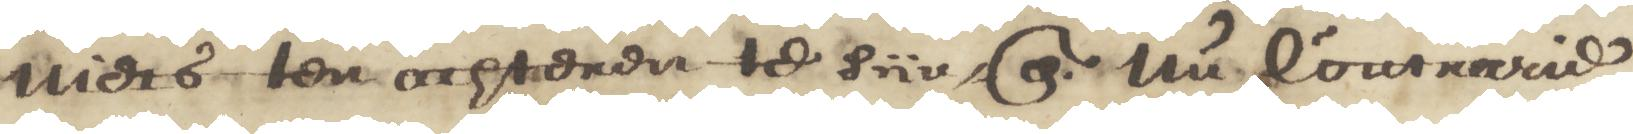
niets ten achteren te sijn, ende nu Contrarie
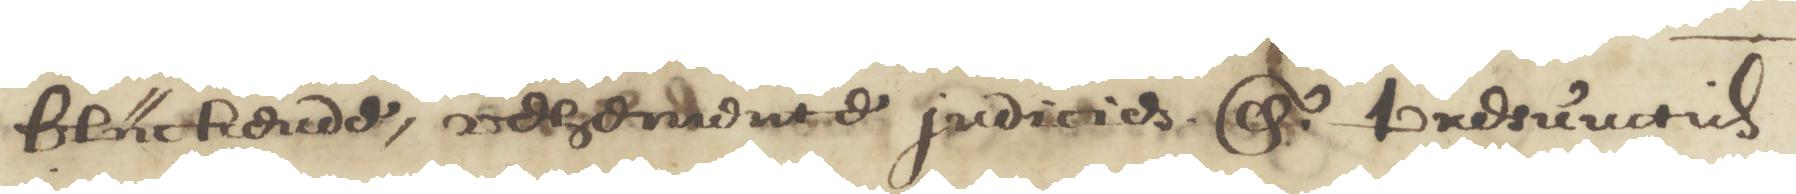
blijckende, vehemente judicien ende Presunctien
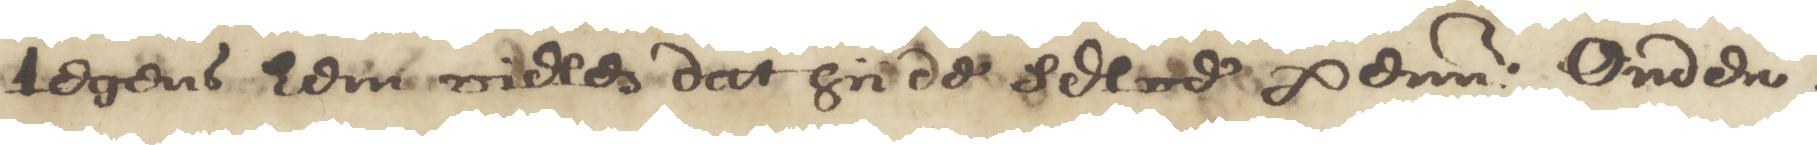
tegens hem vielen dat sij de selve penn: Onder
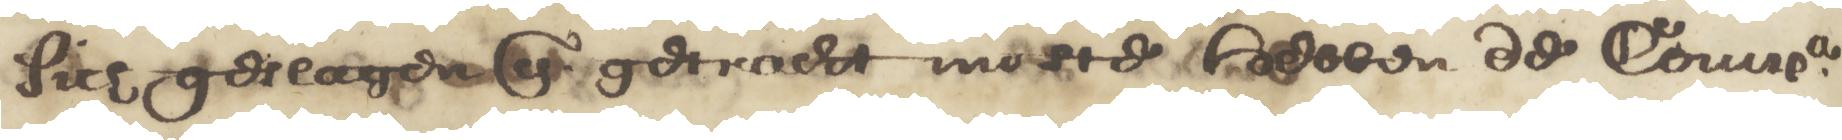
sich geslagen ende getracht moste hebben de Comp„a
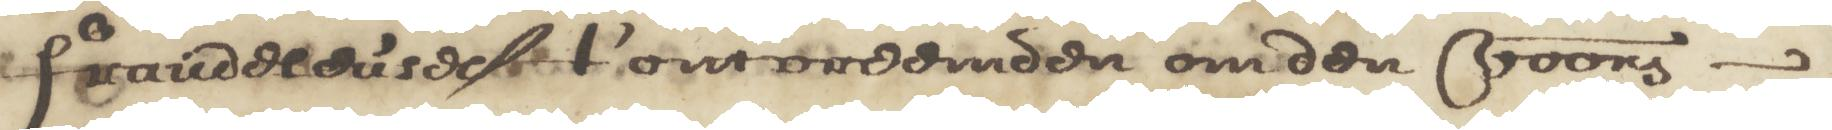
fraudeleuselijk t'ontvreemden om den voorn —
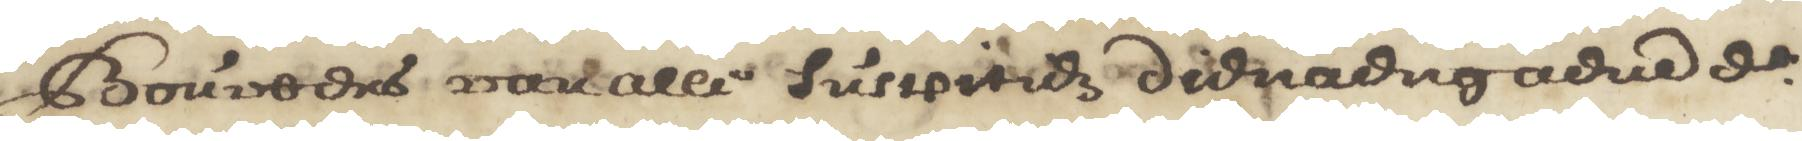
Bouwers van alle suspitien dienaengaende
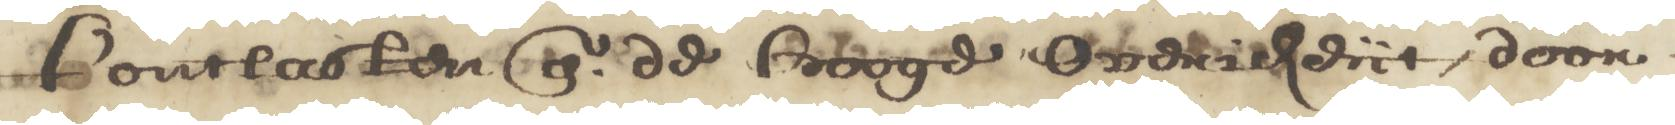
t'ontlasten ende de Hooge Overicheijt, door
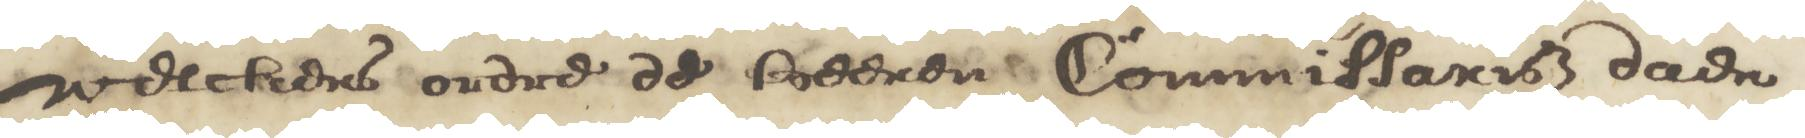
welckers ordre de Heeren Commissarisz daer
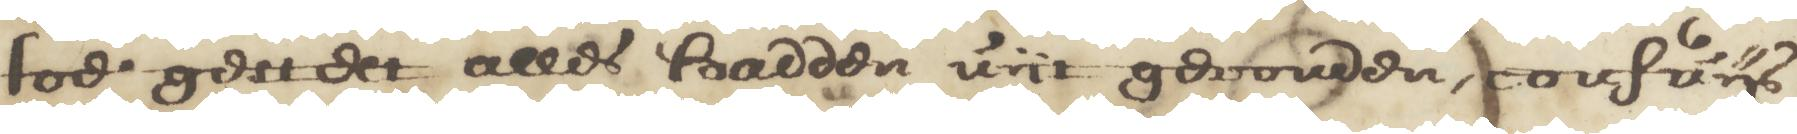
toe gestelt alles hadden uijt gevonden, confuijs
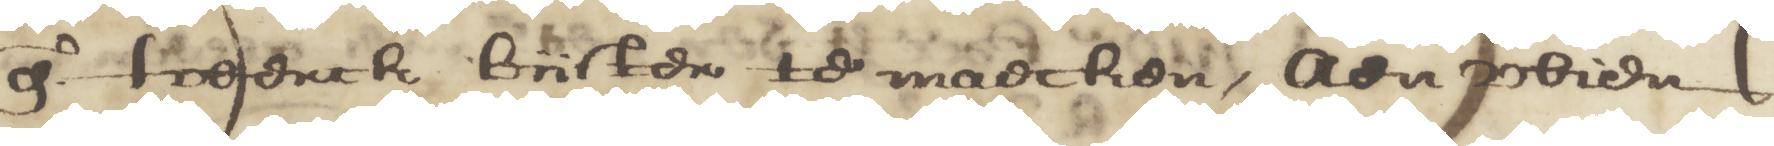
ende twerck bijster te maecken, aen wien
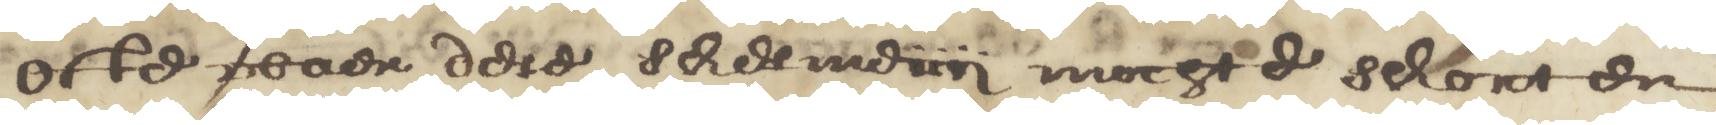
ofte waer dese schelmerij mocht de schort en
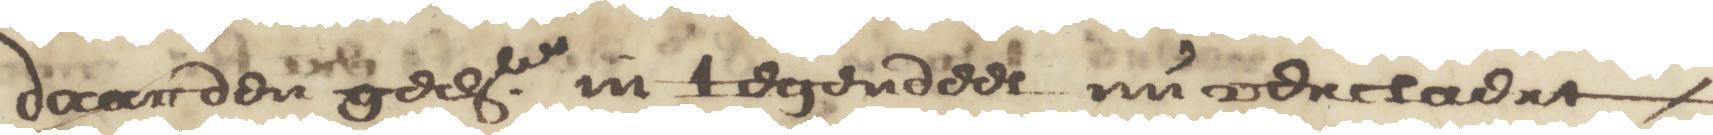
daar den ged„e in tegendeel nu verclaert,
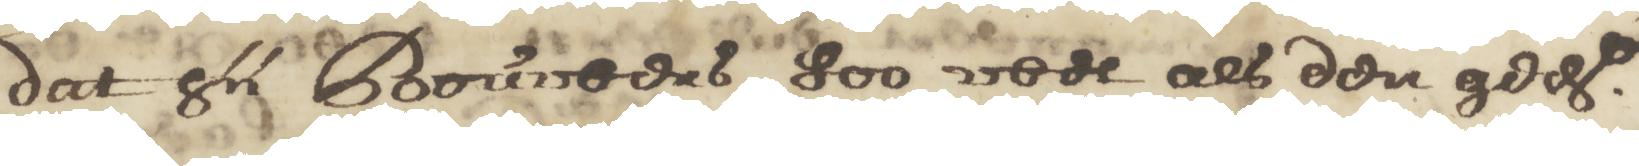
dat hij Bouwers soo wel als den ged„e
